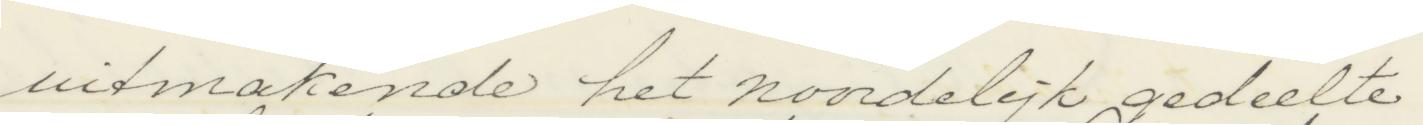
uitmakende het noordelijk gedeelte
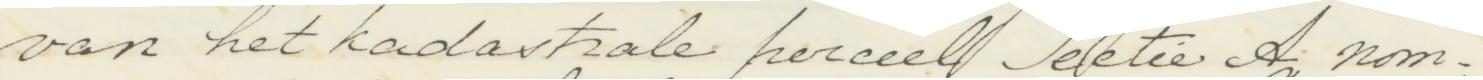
van het kadastrale perceel Sectie A nom-
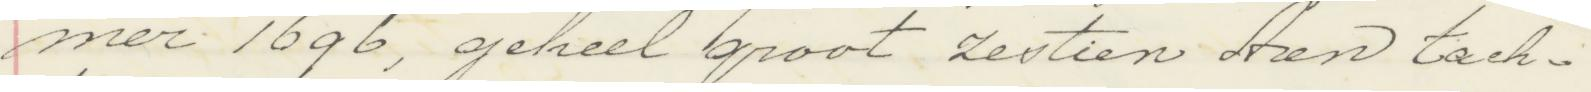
mer 1696, geheel groot zestien Aren tach-
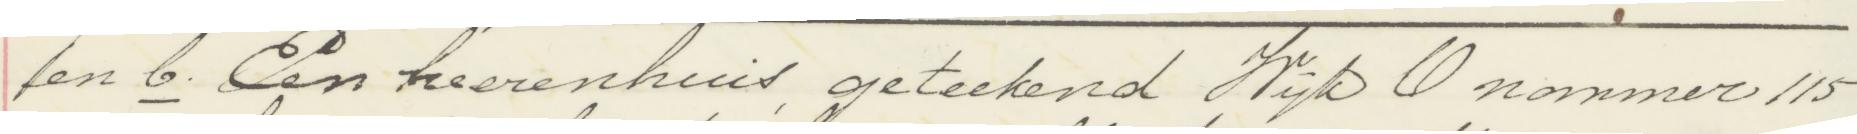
en b. Ean heerenhuis, geteekend Wijk O nommer 115
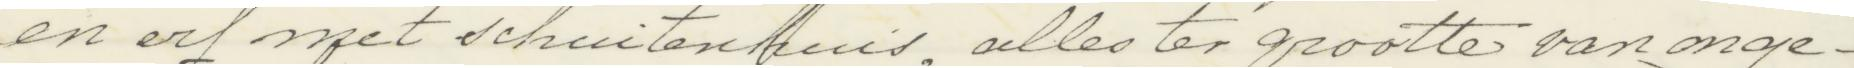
en erf met schuitenhuis, alles ter grootte van onge-
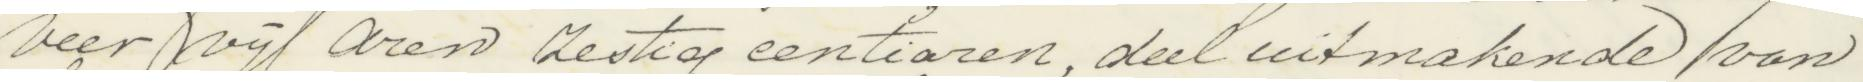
veer vijf aren zestig centiaren, deel uitmakende van
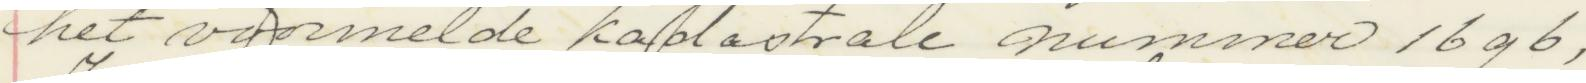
het voormelde kadastrale nummer 1696
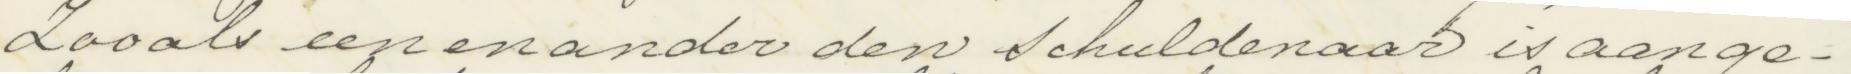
Zooals een en ander den schuldenaar is aange-
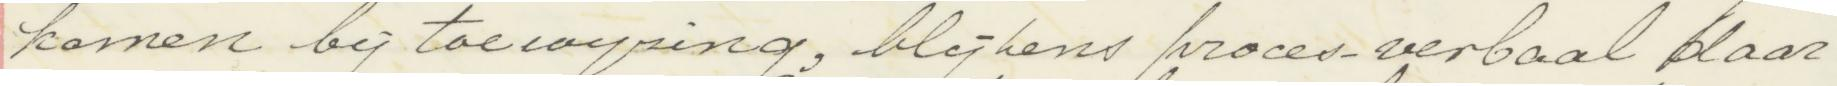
komen bij toewijzing, blijkens proces-verbaal daar
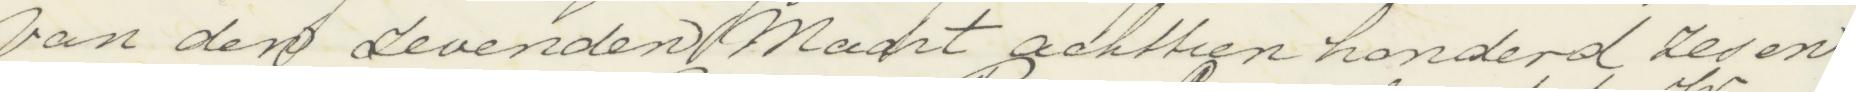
van den zevenden Maart achttien honderd zes en
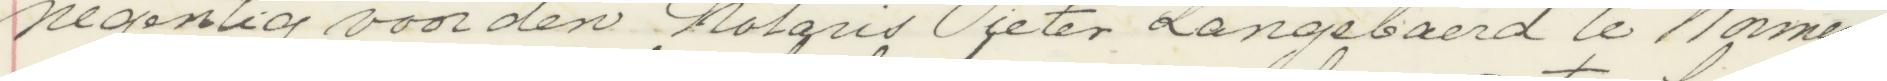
negentig voor den Notaris Pieter Langebaerd te Wormer-
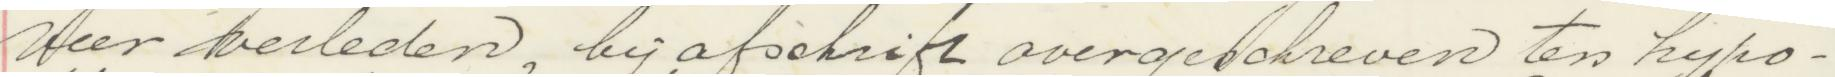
veer verleden bij afschrift overgeschreven ten hypo-
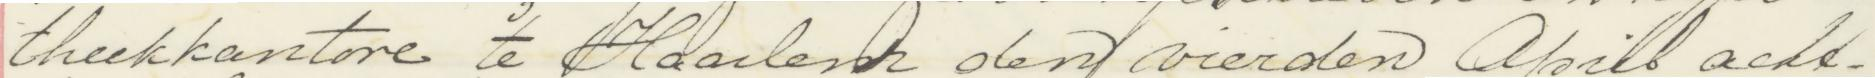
theekkantore te Haarlem den vierden April acht-
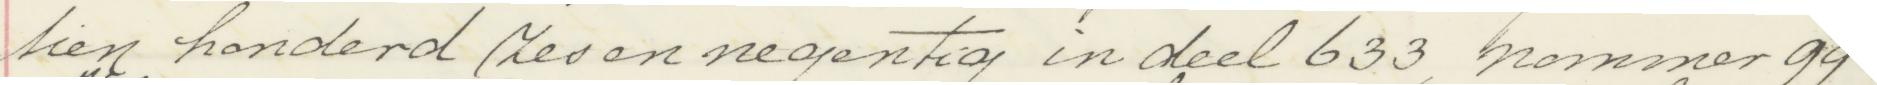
tien honderd zes en negentig in deel 633, nommer 99.
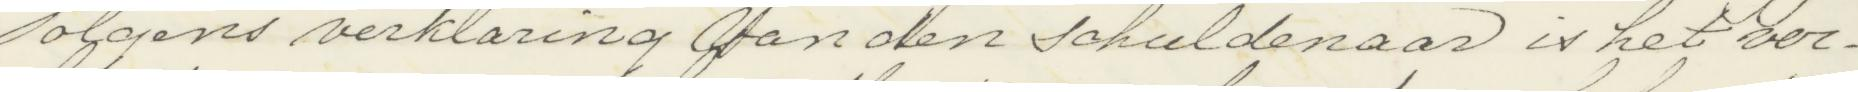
Volgens verklaring van den schuldenaar is het ver-
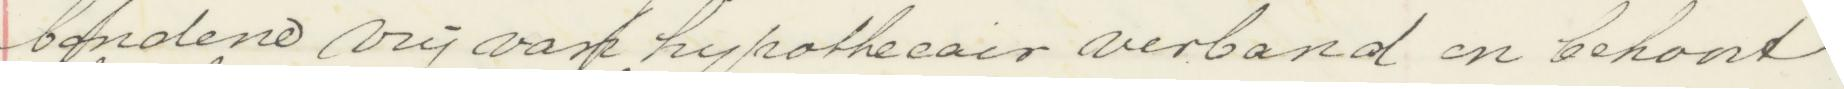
bondene vrij van hypothecair verband en behoort
